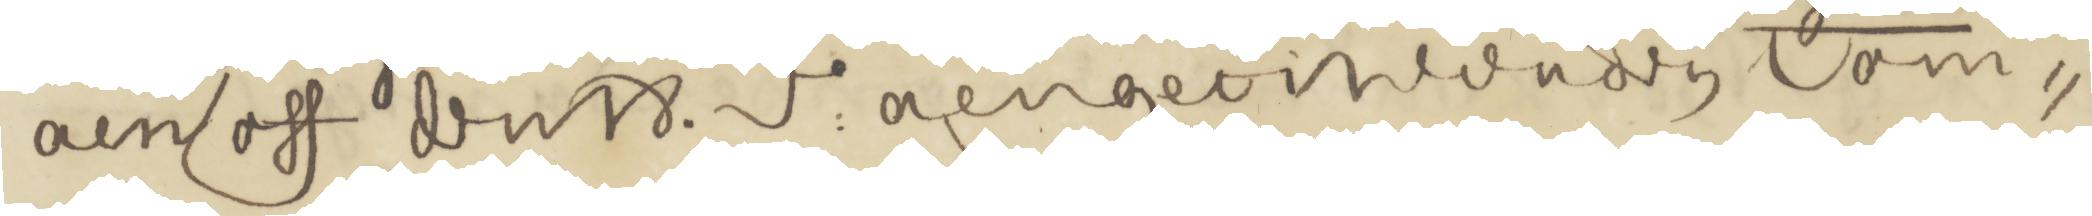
aen off den 18. d:o aengeciteerden Com„
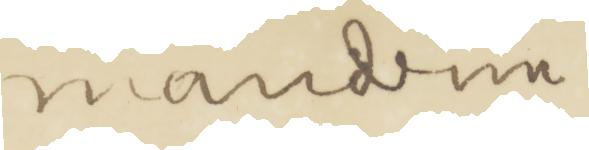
mandeur
